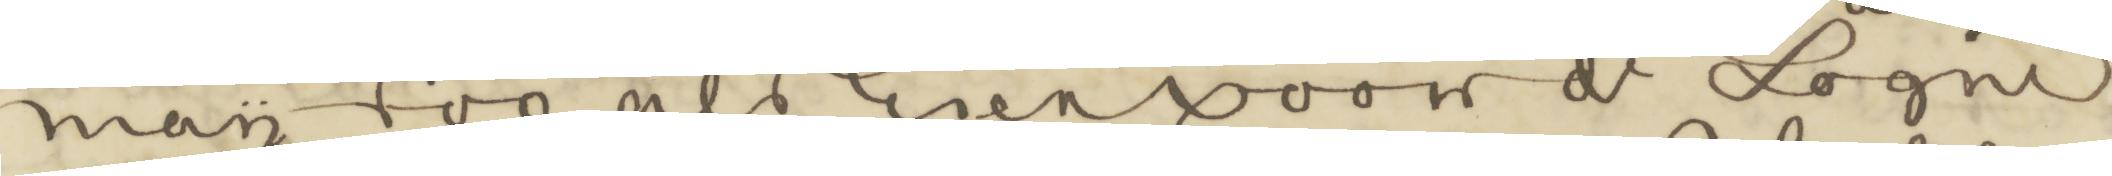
maij soo als hier voor de Logie
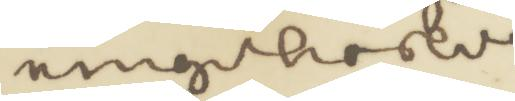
ringe koste
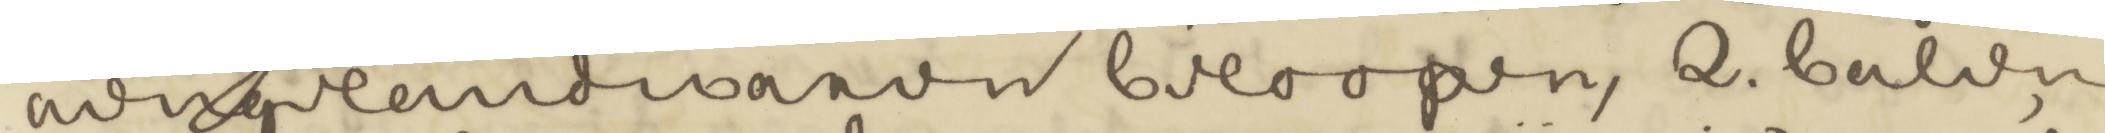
aengeland waren beloopen, 2. balen
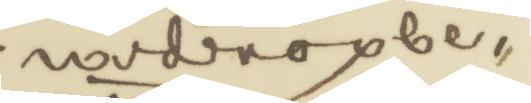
wederop be„
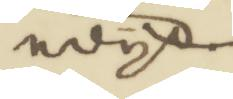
reijd
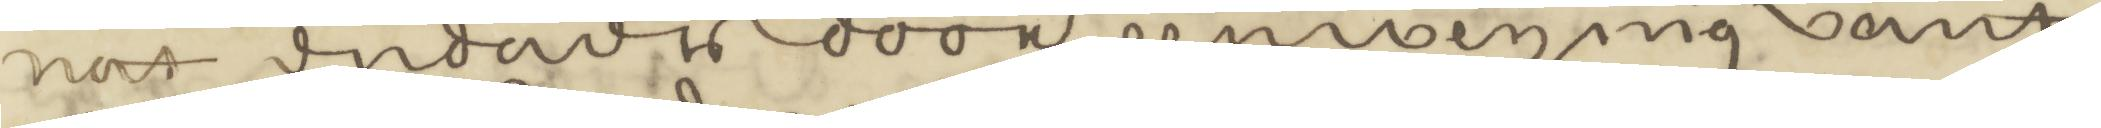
nat en daerdoor een weijnig van't
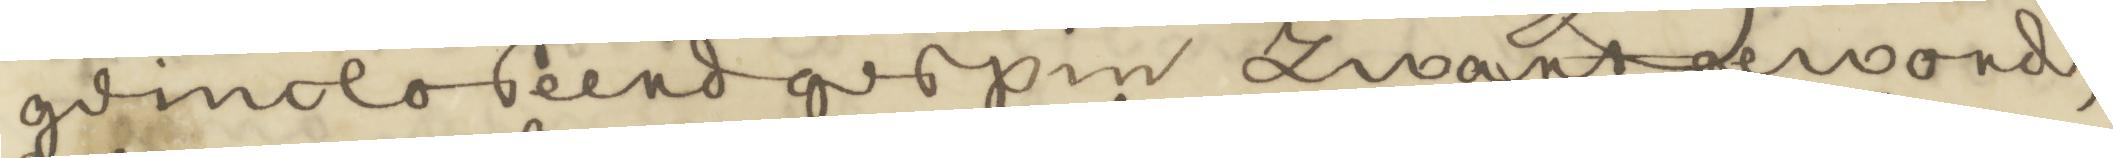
geincloseerd gespin zwart geworden
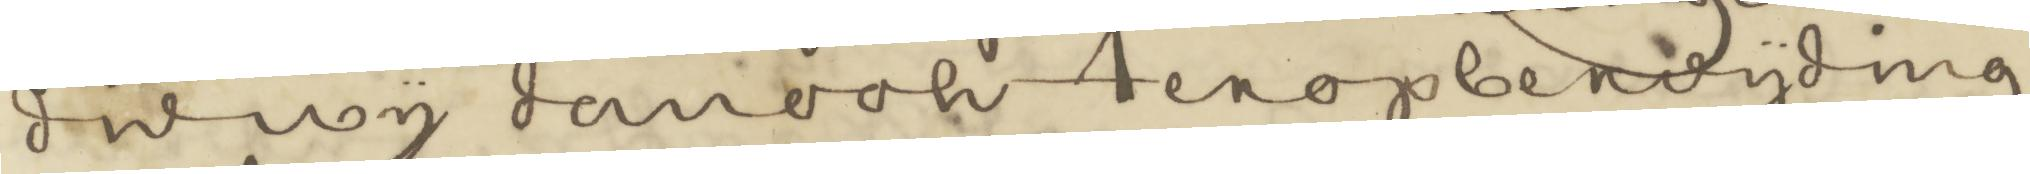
die wij dan ook ter opbereijding
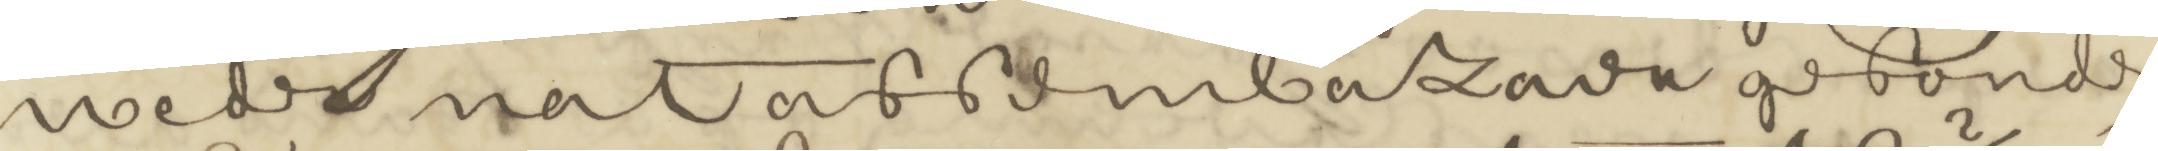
weder na Cassembazaer gesonden
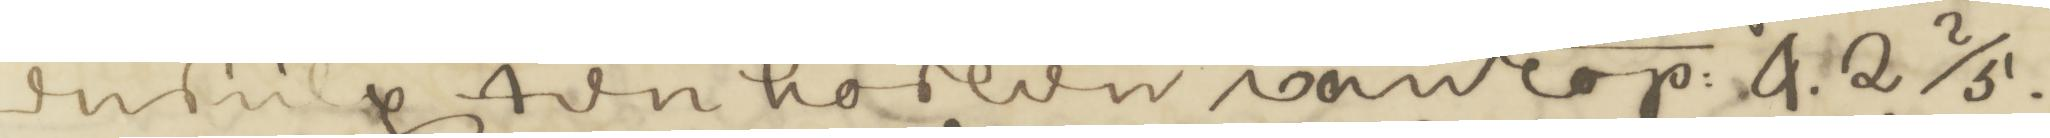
en sulx ten kosten van rop: 4. 2 3/5.
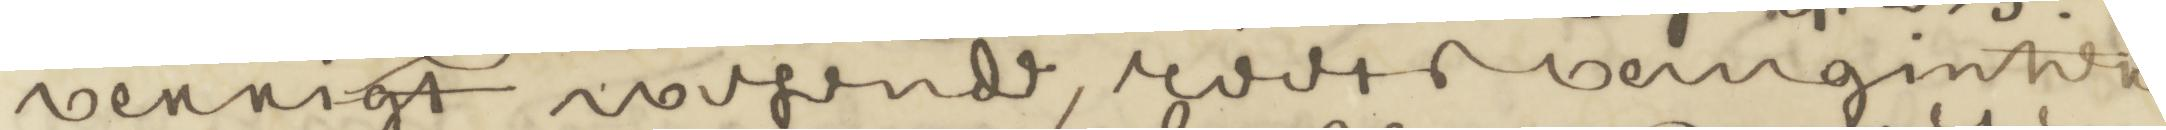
verrigt wesende, reets van ginter
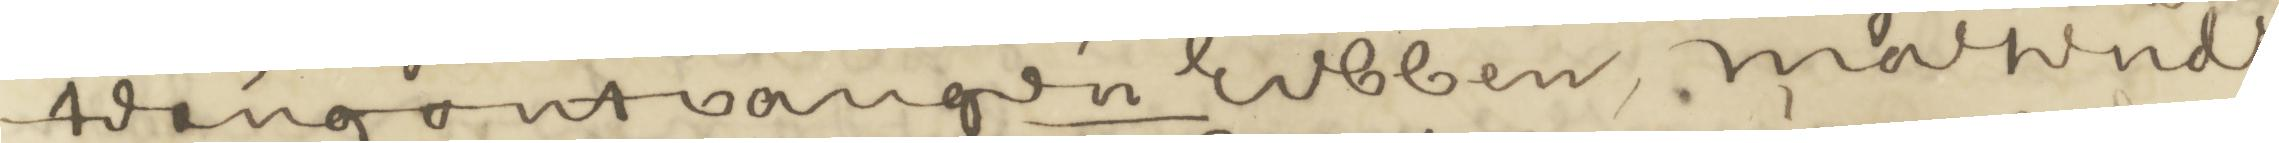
terug ontvangen hebben, moetende
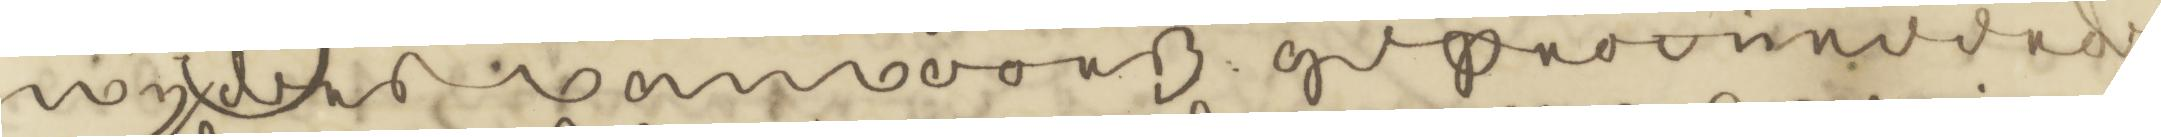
wyders van voorsz: geprocureerde
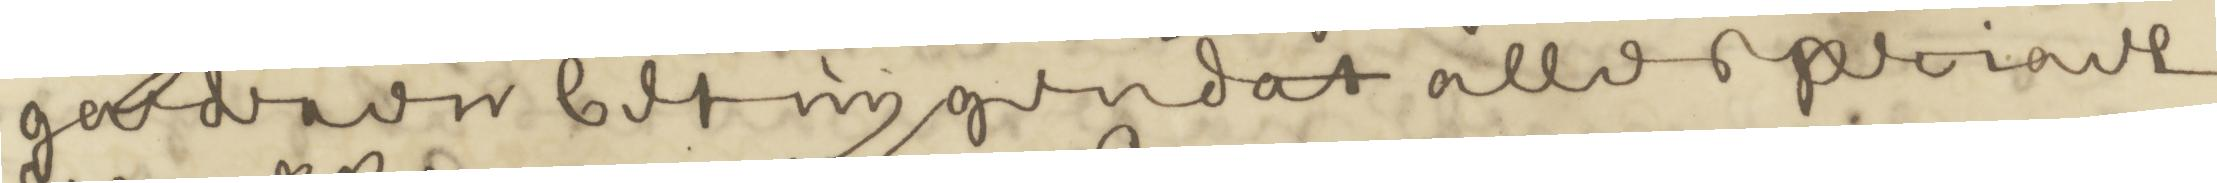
goederen betuijgen dat alle speciael
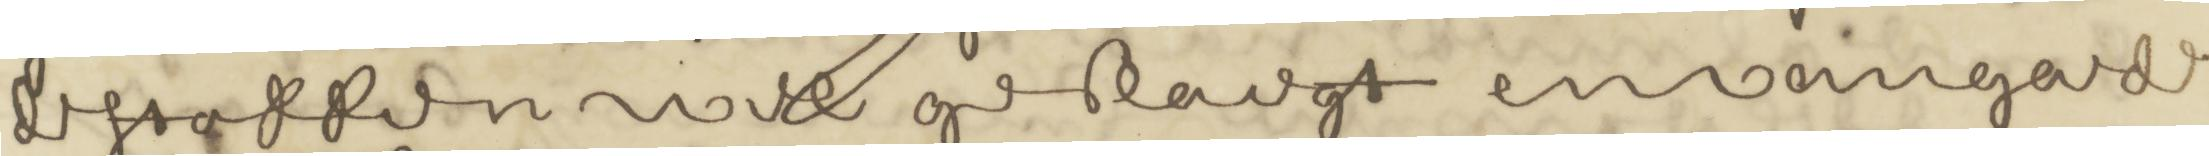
de stoffen wel geslaegt en van goede
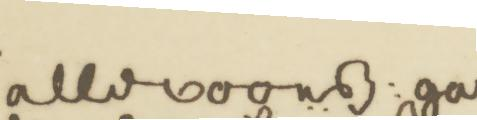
alle voorsz: goe
